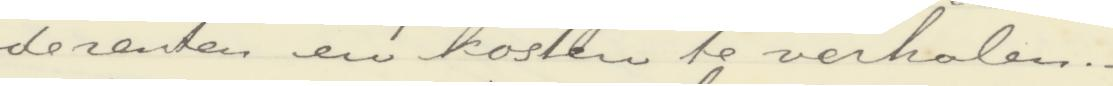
de renten en kosten te verhalen.
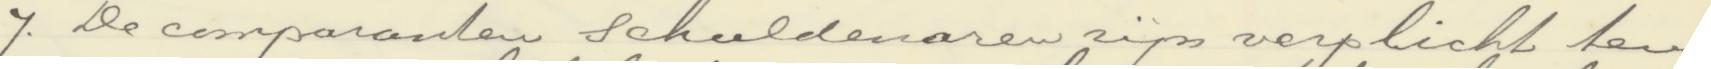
7. De comparanten schuldenaren zijn verplicht ten
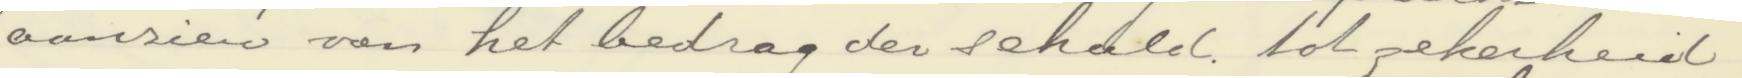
aanzien van het bedrag der schuld, tot zekerheid
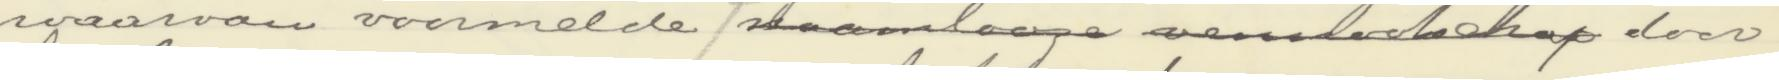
waarvan voormelde ¶ naamlooze vennootschap door
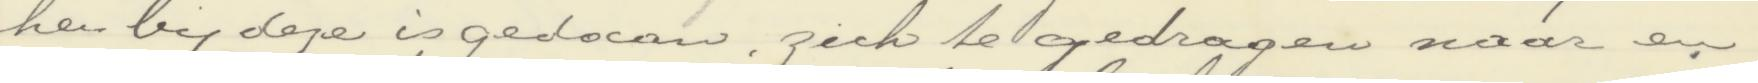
hen by deze is gedaan, zich te gedragen naar en
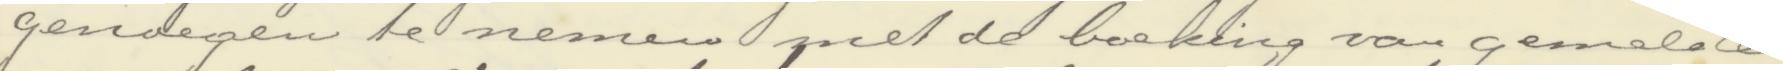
genoegen te nemen met de boeking van gemelde
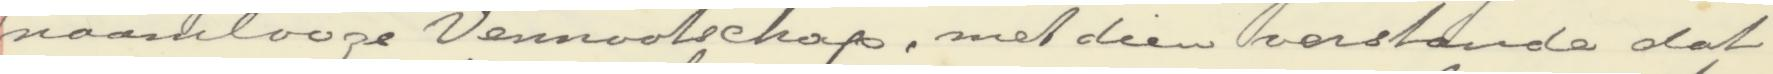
naamlooze vennootschap, met dien verstande dat
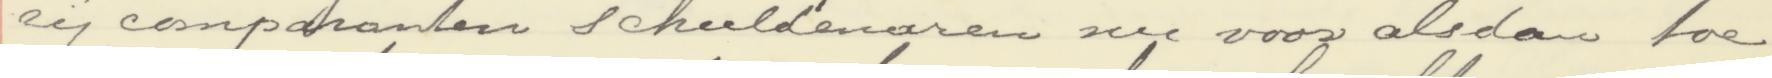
zij comparanten schuldenaren u voor als dan toe
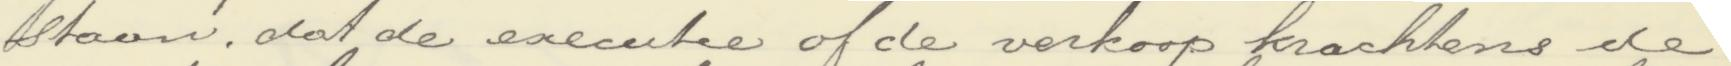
staan, dat de executie of de verkoop krachtens de
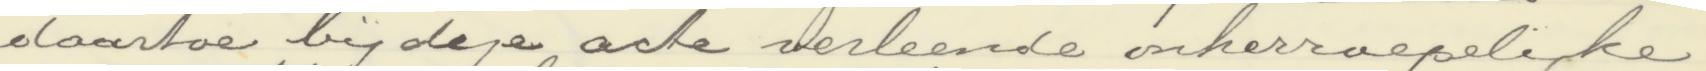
daartoe bij deze acte verleende onherroepelijke
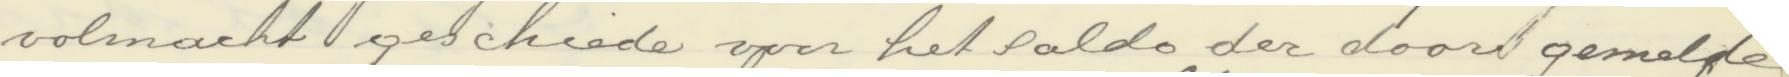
volmacht geschiede voor het saldo der door gemelde
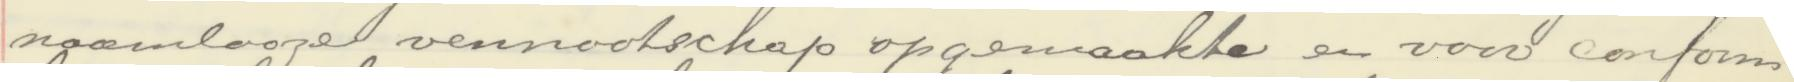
naamlooze vennootschap opgemaakte en voor confom
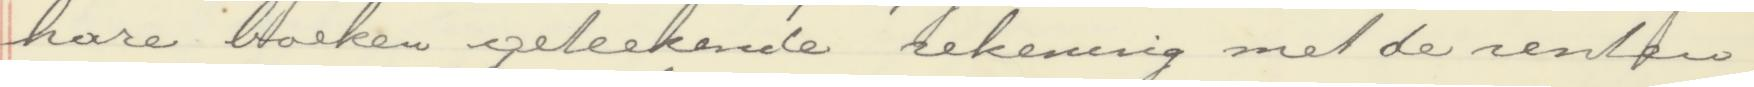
hare boeken geteekende rekening met de renten
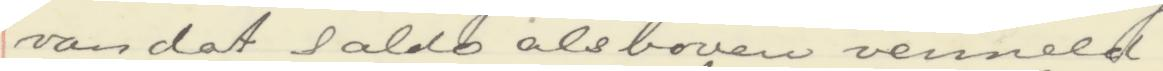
van det saldo als boven vemeld
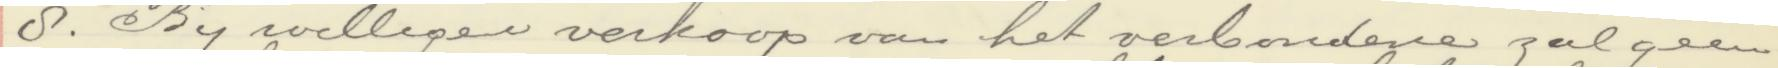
8. Bij willigen verkoop van het verbondene zal geen
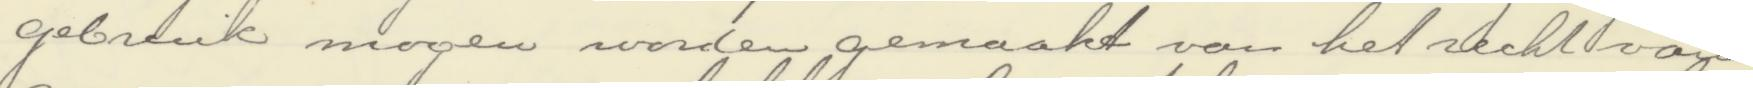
gebruik mogen worden gemaakt van het recht van
